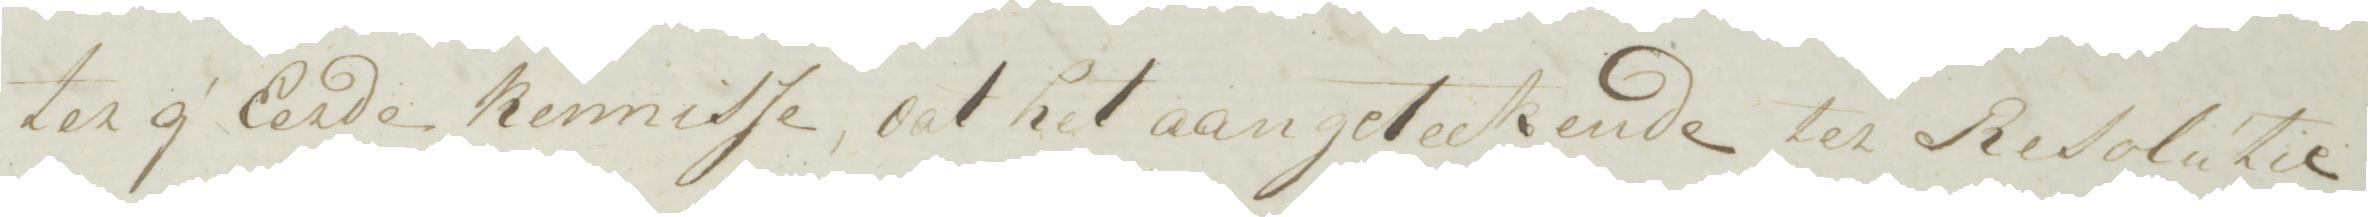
ter g’Eerde kennisse, dat het aangeteekende ter Resolutie
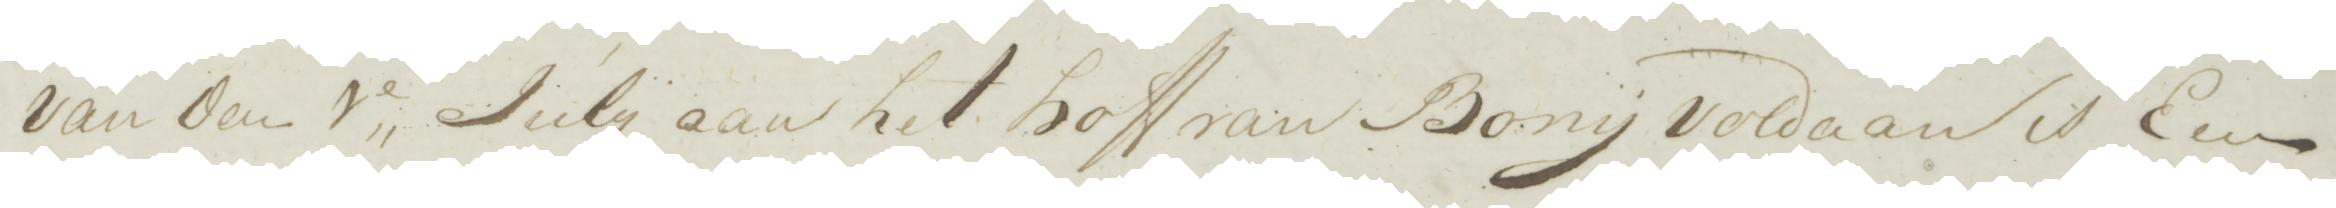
van den 1„e Iulij aan het hoff van Bonij voldaan is Een
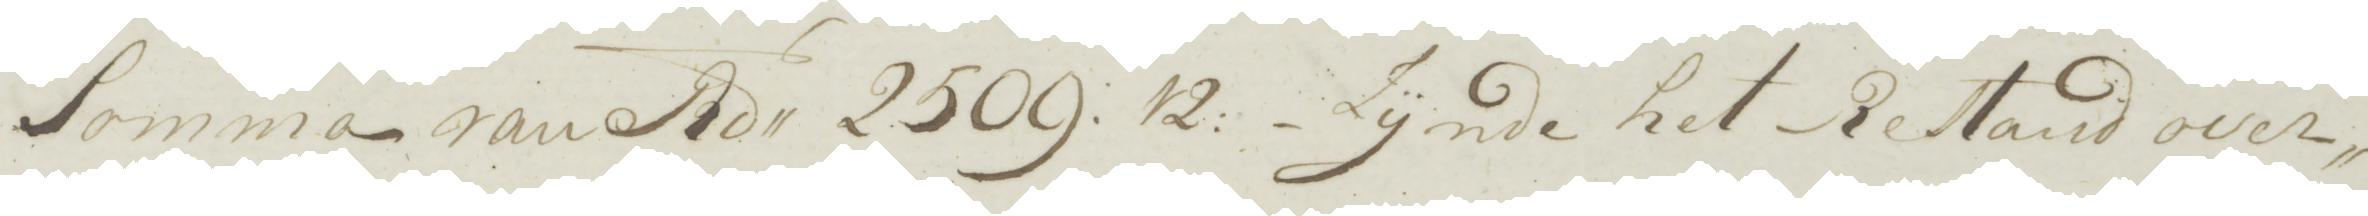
somma van Rd„s 2509: 12: - zijnde het Restand over„
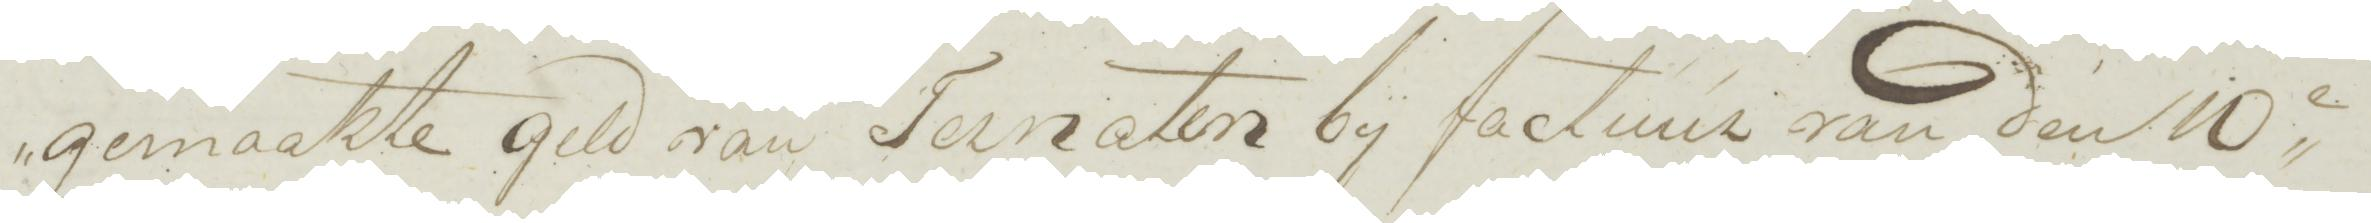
„gemaakte geld van Ternaten bij factuur van den 10„e
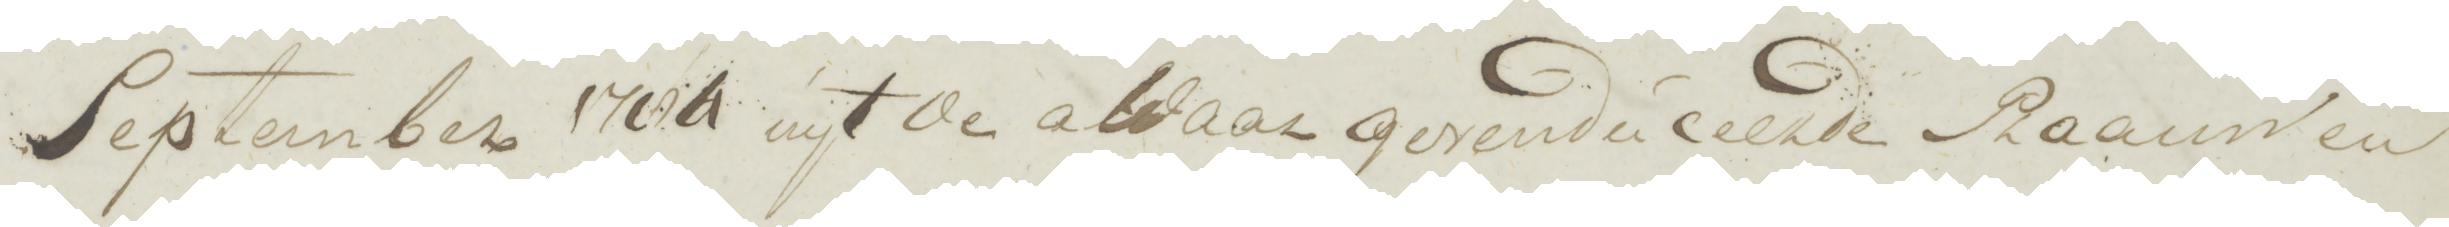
september 1784: uijt de aldaar gevenduceerde Praauw en
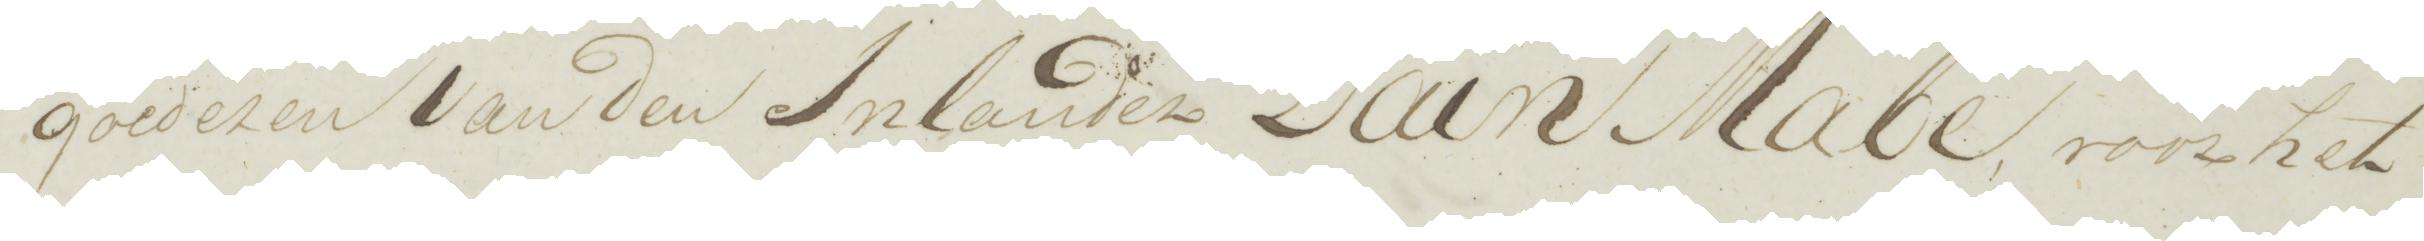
goederen van den Inlander Dain Mabe, voor het
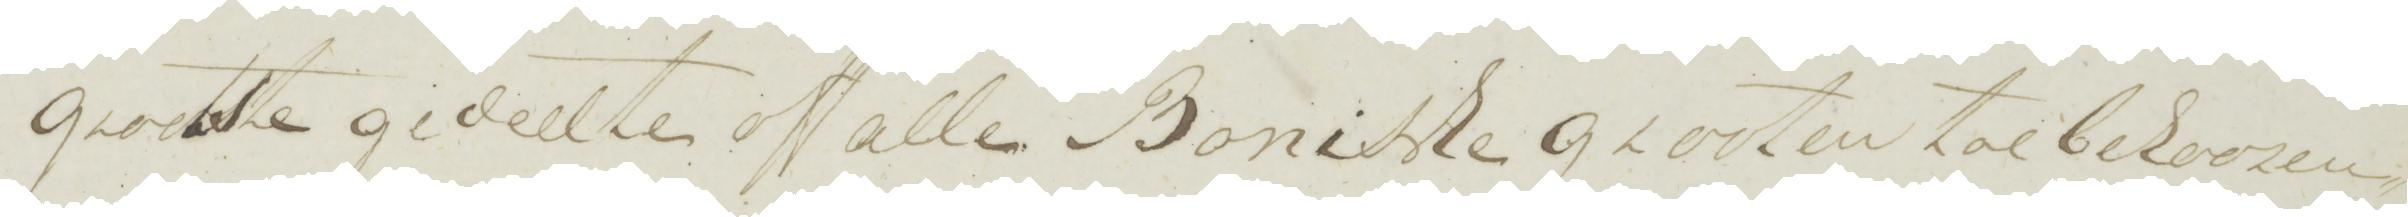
grootste gedeelte off alle Bonische grooten toebehooren
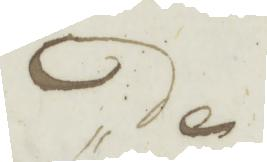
de
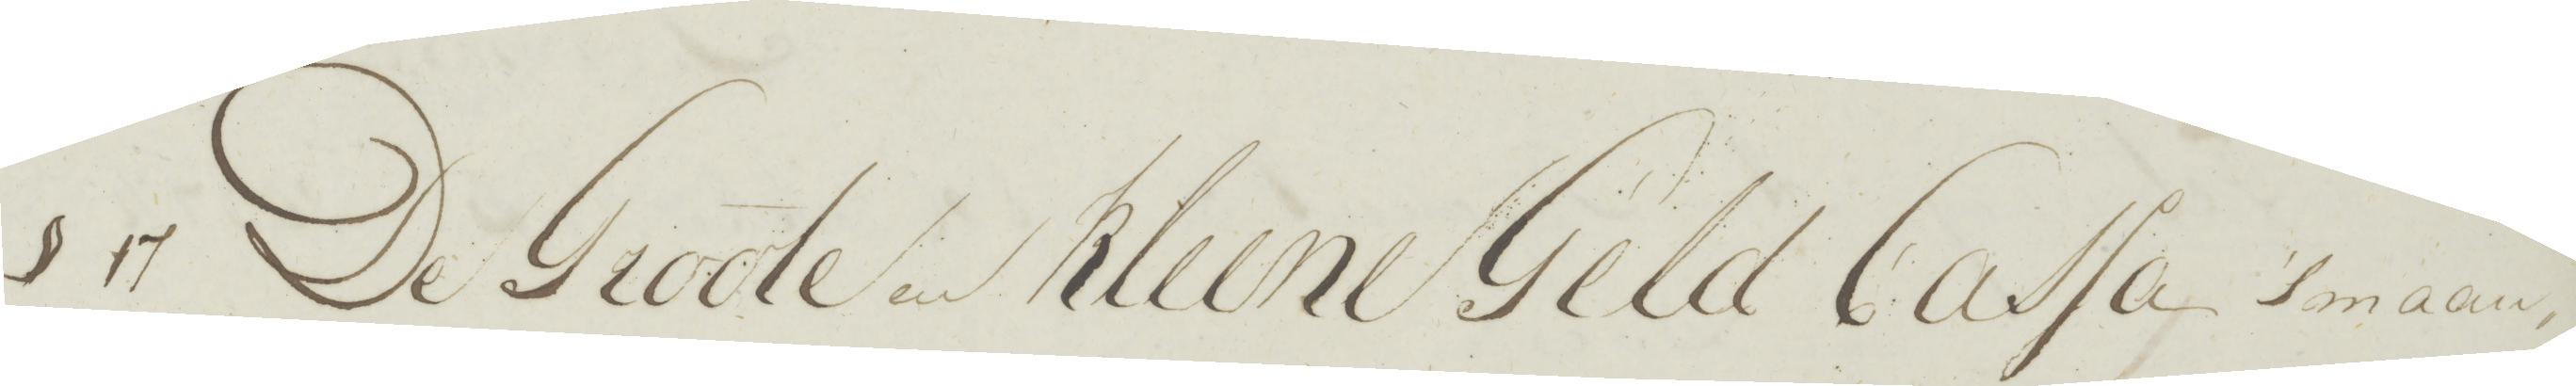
§ 17 De Groote en kleene Geld Cassa 'smaan„
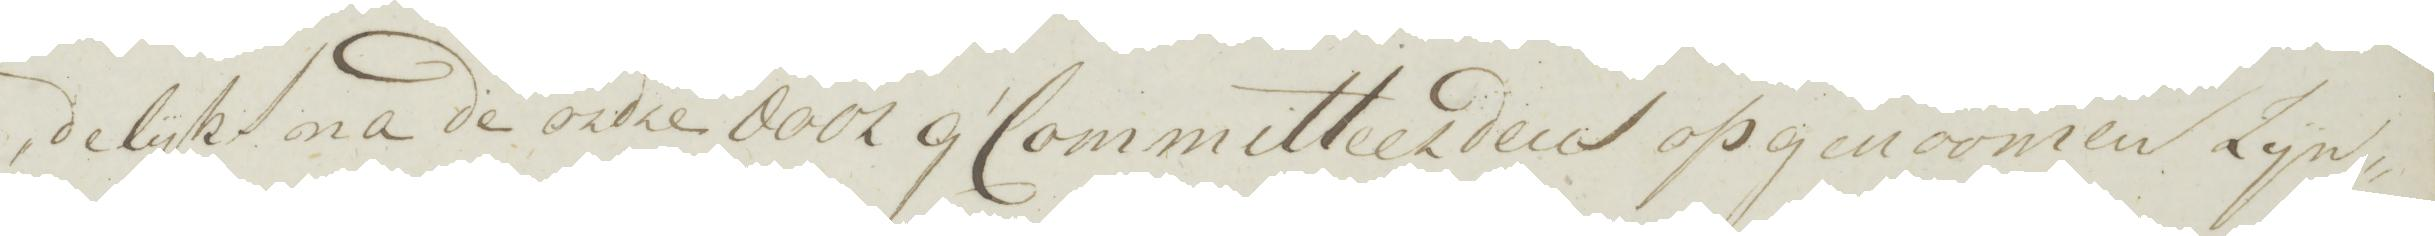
„delijks na de ordre door g’Committeerdens opgenoomen zijn„
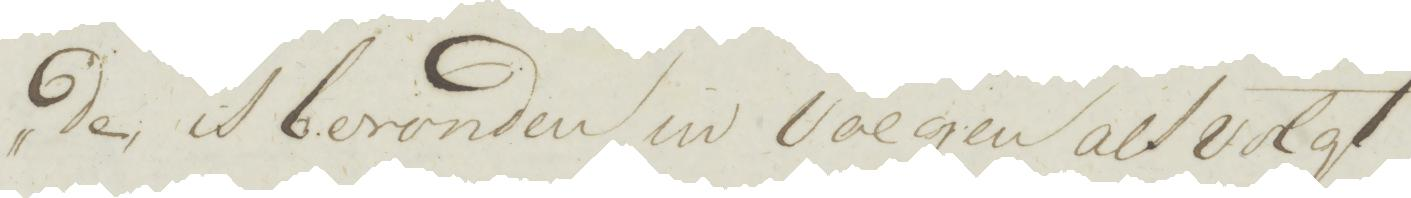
„de is bevonden in voegen als volgt
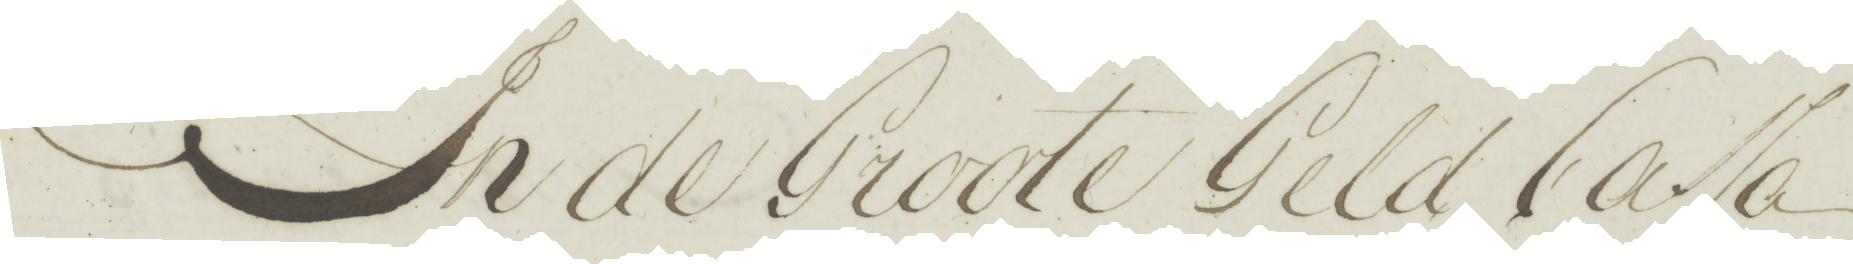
In de Groote Geld Cassa
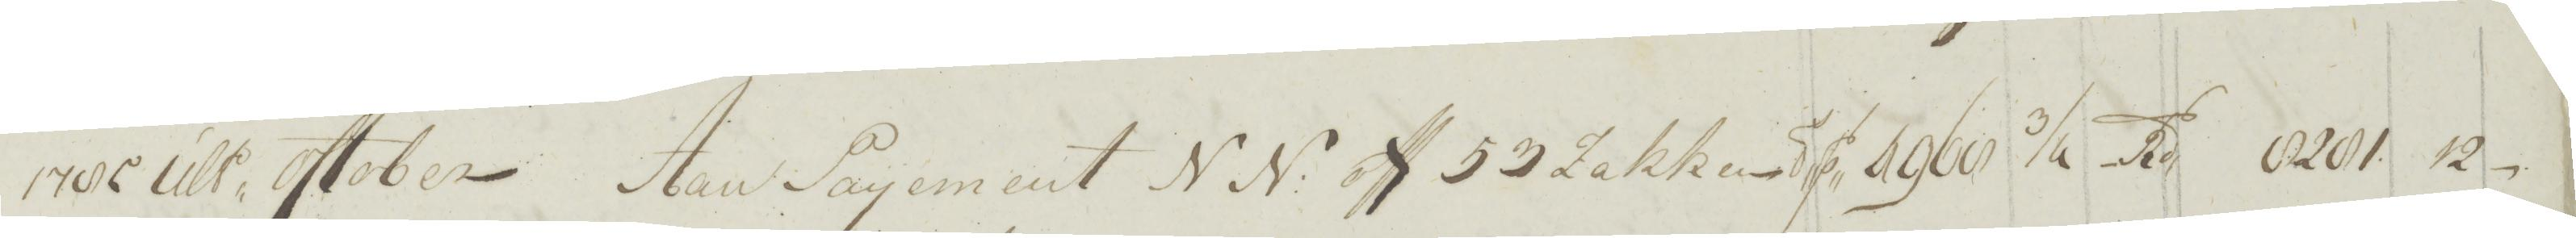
1785 ult„o october Aan Paijement N N: off 53 Zakken ds p„s 4968 ¾ – Rd,s 8281. 12 –.
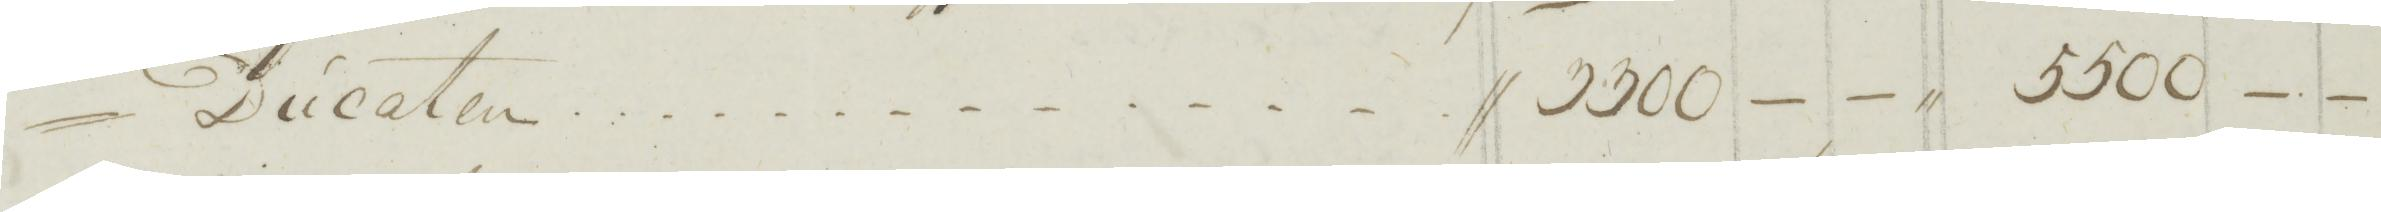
= Ducaten . . . . . . - - - . - - - . „ 3300 – – „ 5500 – . –
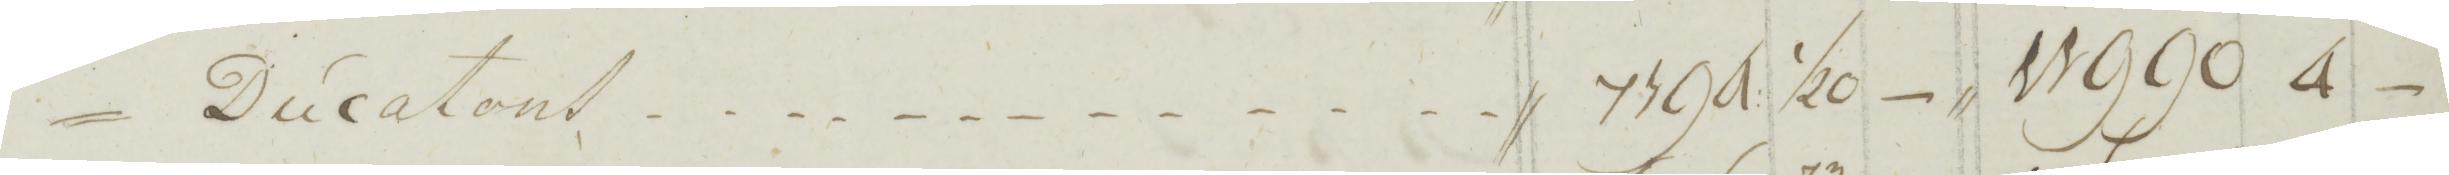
= Ducatons - - - - - - - - - - - - - „7794: 1/20 – „ 11990 4 –
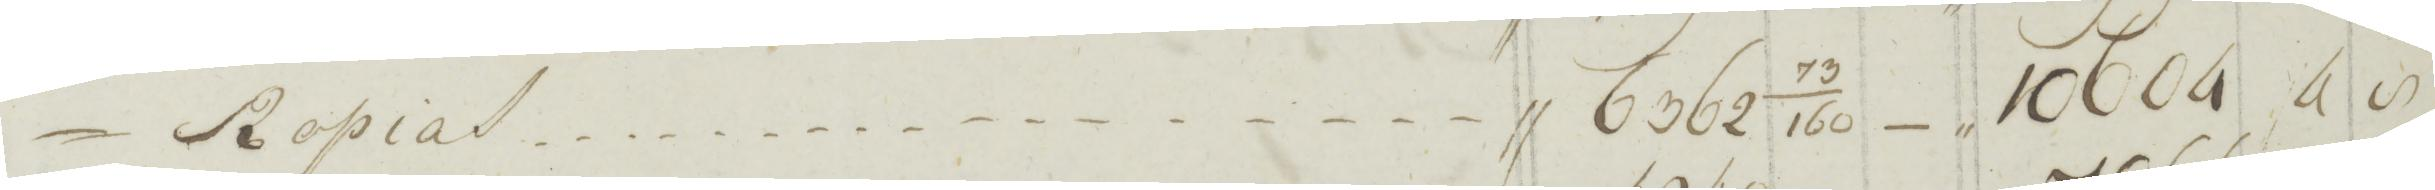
= Ropias . . . - - - - . - - - - - - - - - „6362 73/160 – „10604 4 8
